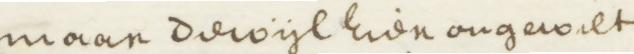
maar dewijl hier ongewilt
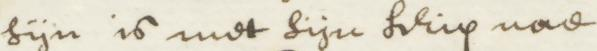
sijn is met sijn schip nae
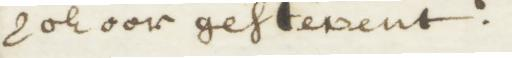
johoor gestevent.
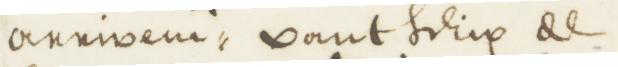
arrivem„t van 't schip de
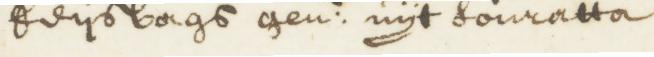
feijsbags gen:t uijt souratta
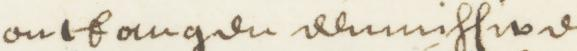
ontfangen eenmissive
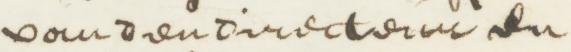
van den directeur en
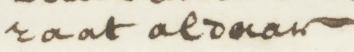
raat aldaar
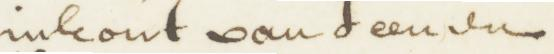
inhout van 't een en
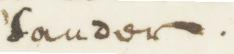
't ander.
